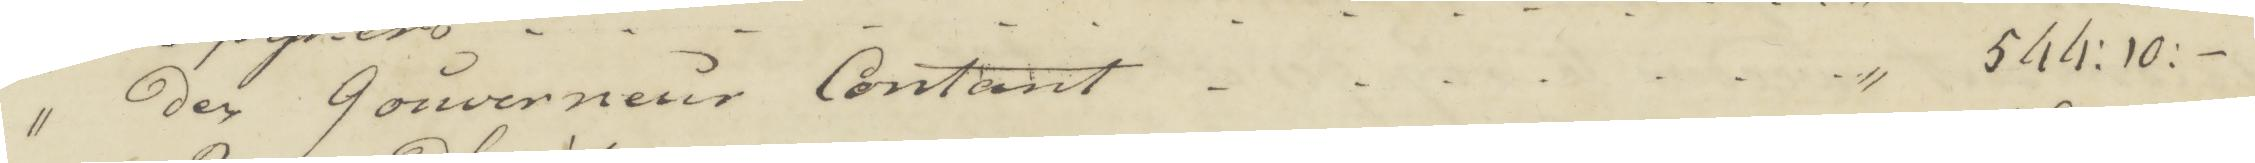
„ den Gouverneur Contant - - - - - - - „ 544:10:—
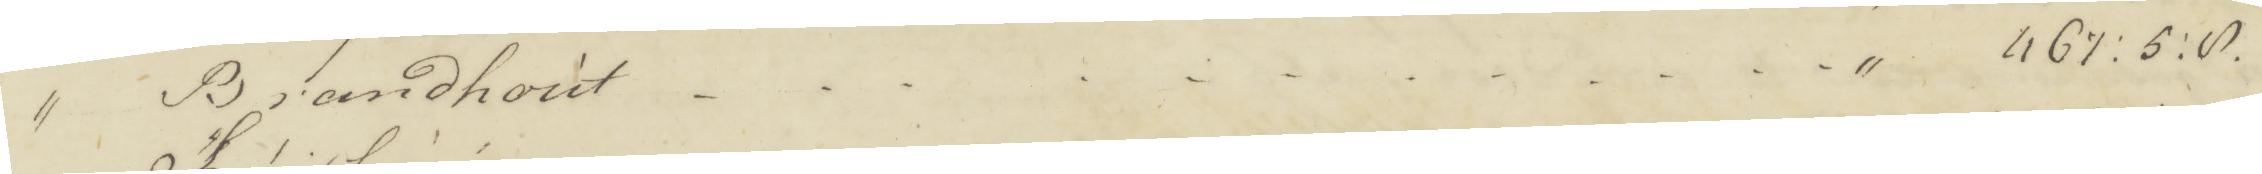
„ Brandhout - - - - - - - - - - - - „ 467: 5:8.
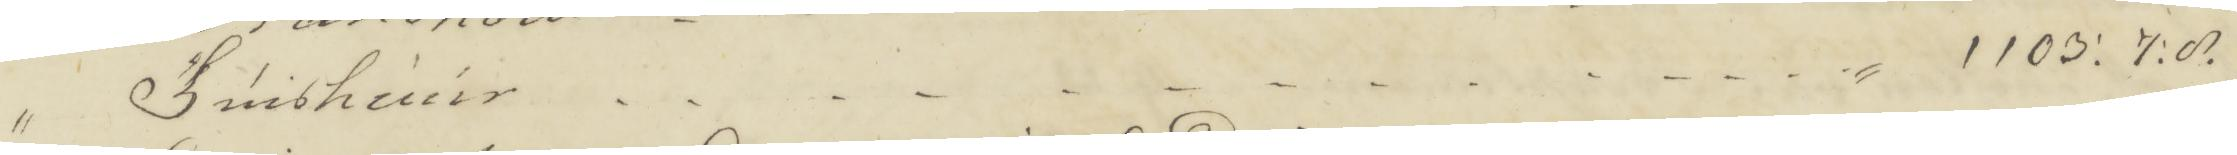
„ Huishuur - - - - - - - - - - - - - „ 1103: 7:8.
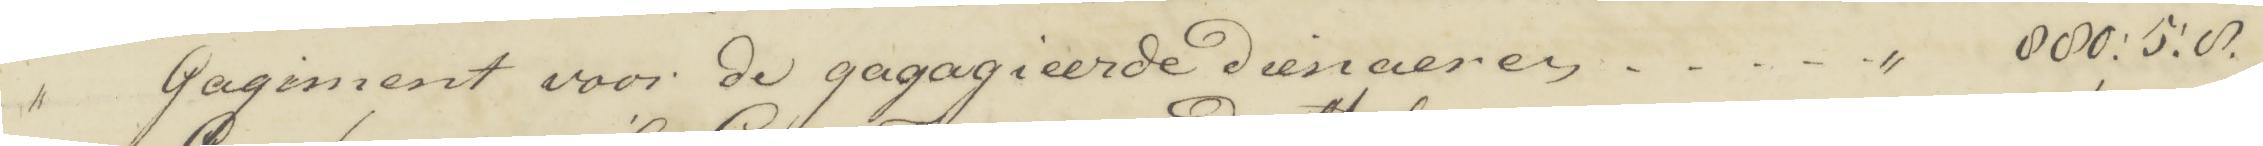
„ Gagiment voor de gegagieerde dienaeren - - - - „ 880:5:8.
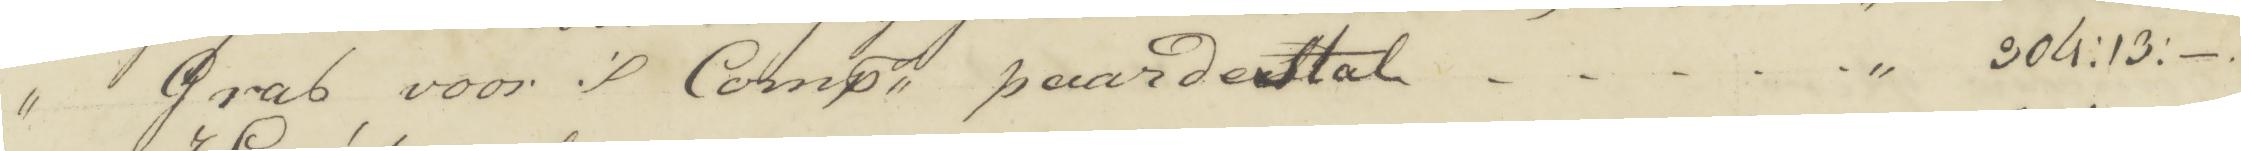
„ Gras voor ’s Comp„s paardestal - - - - - „ 304:13:—.
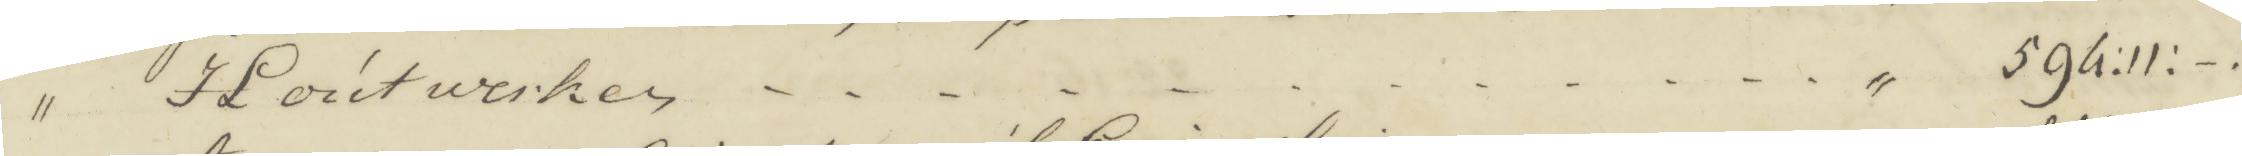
„ Houtwerken - - - - - - - - - - - - „ 594:11: —.
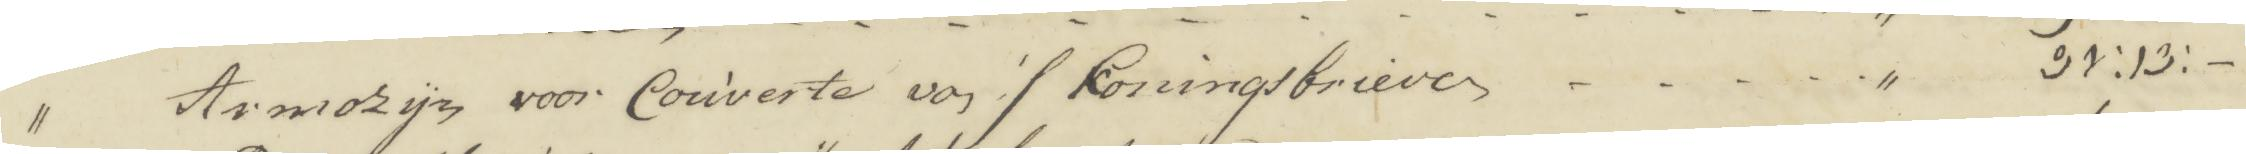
„ Armozijn voor Couverte van 's koningsbrieven - - - - „ 31:13:—
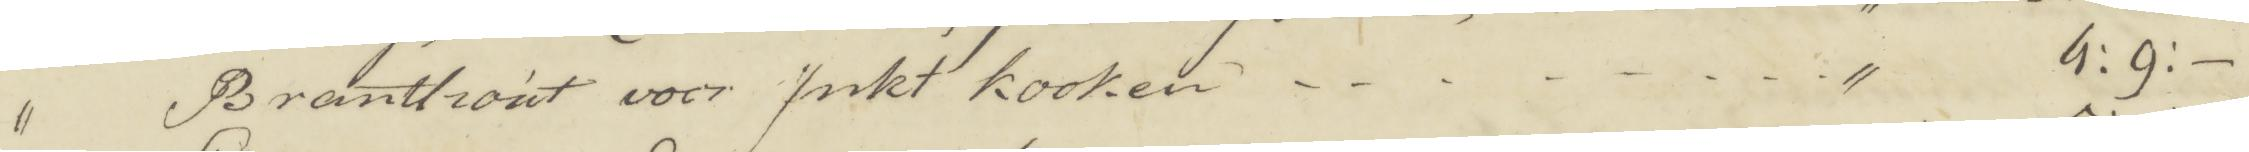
„ Branthout voor Jnkt kooken - - - - - - - - „ 4: 9:—
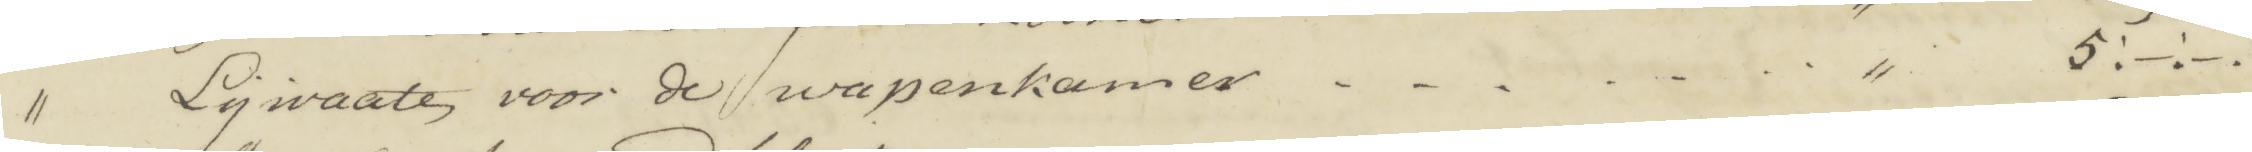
„ Lijwaaten voor de wapenkamer - - - - - - - „ 5: —:—.
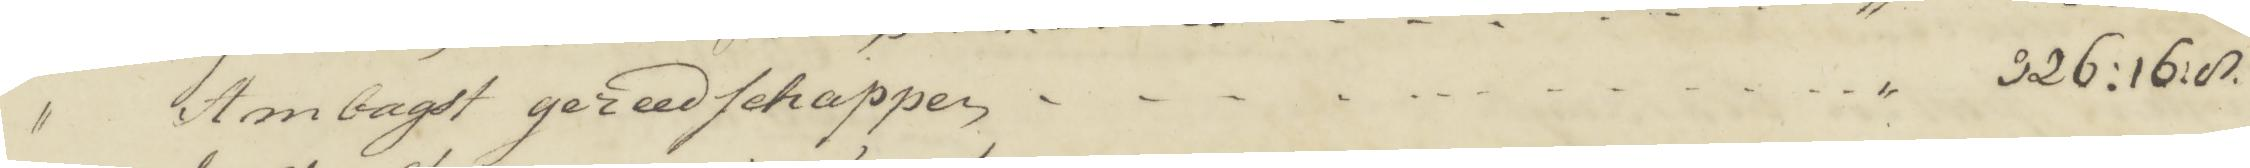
„ Ambagst gereedschappen - - - - - - - - - - - - „ 326:16:8.
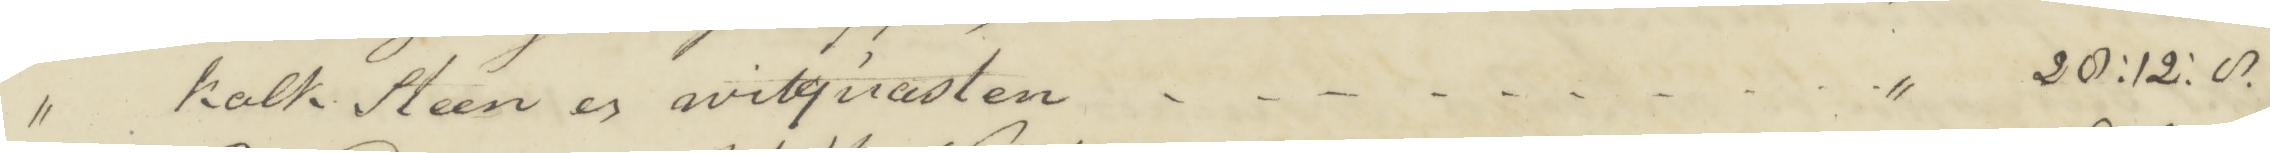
„ kalk steen en witquasten - - - - - - - - - „ 28:12:8.
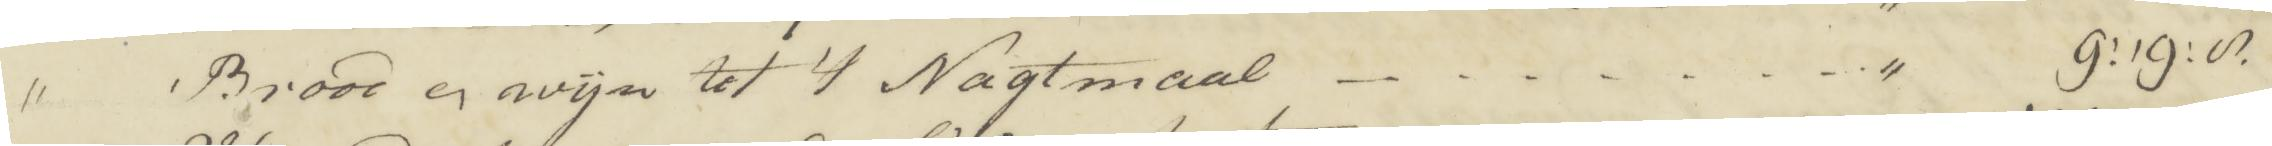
„ Brood en wijn tot 't Nagtmaal - - - - - - - - „ 9:19:8.
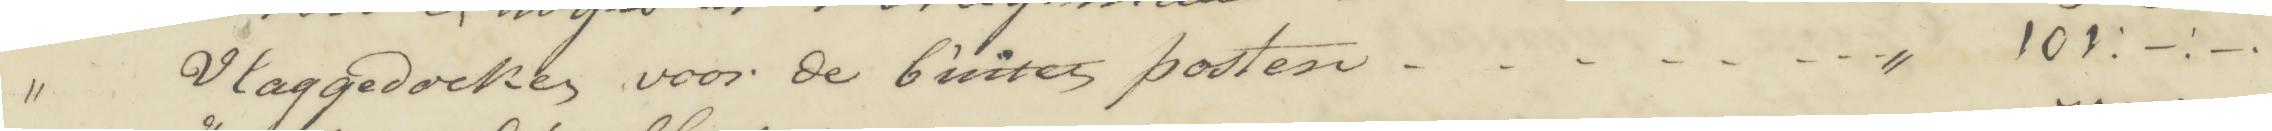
„ Vlaggedoeken voor de buiten posten - - - - - - - „ 101: —:—.
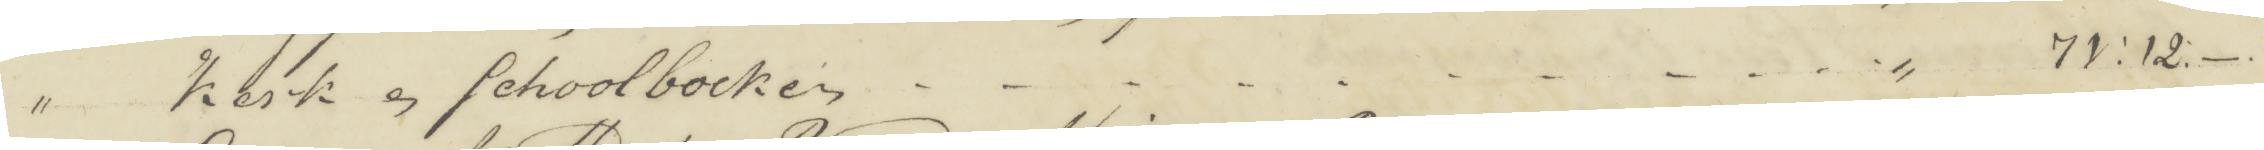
„ Kerk en schoolboeken - - - - - - - - - - „ 71:12:—.
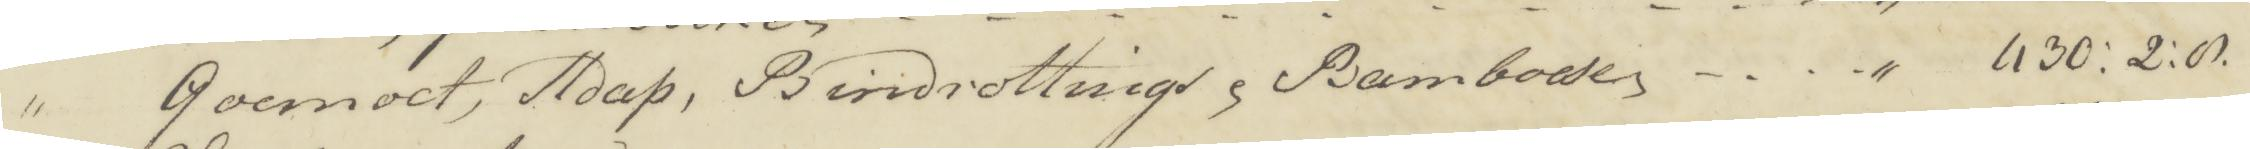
„ Goemoet, Adap, Bindrottings en Bamboesen - - - - „ 430: 2:8.
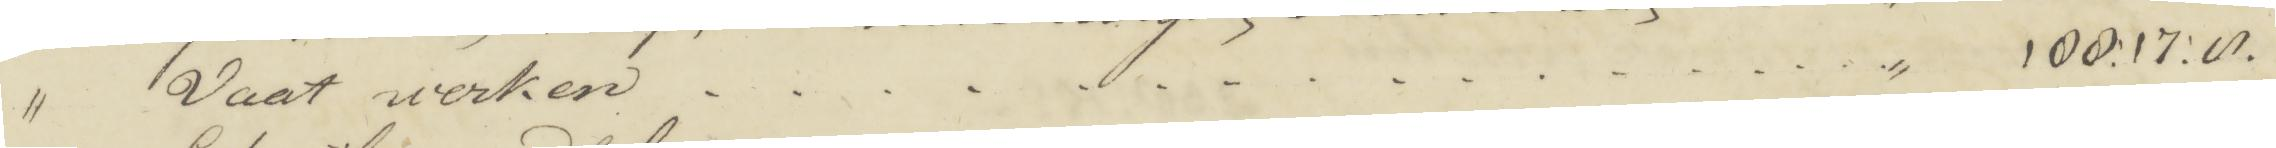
„ Vaat werken - - - - - - - - - - - - - - - - „ 188:17:8.
